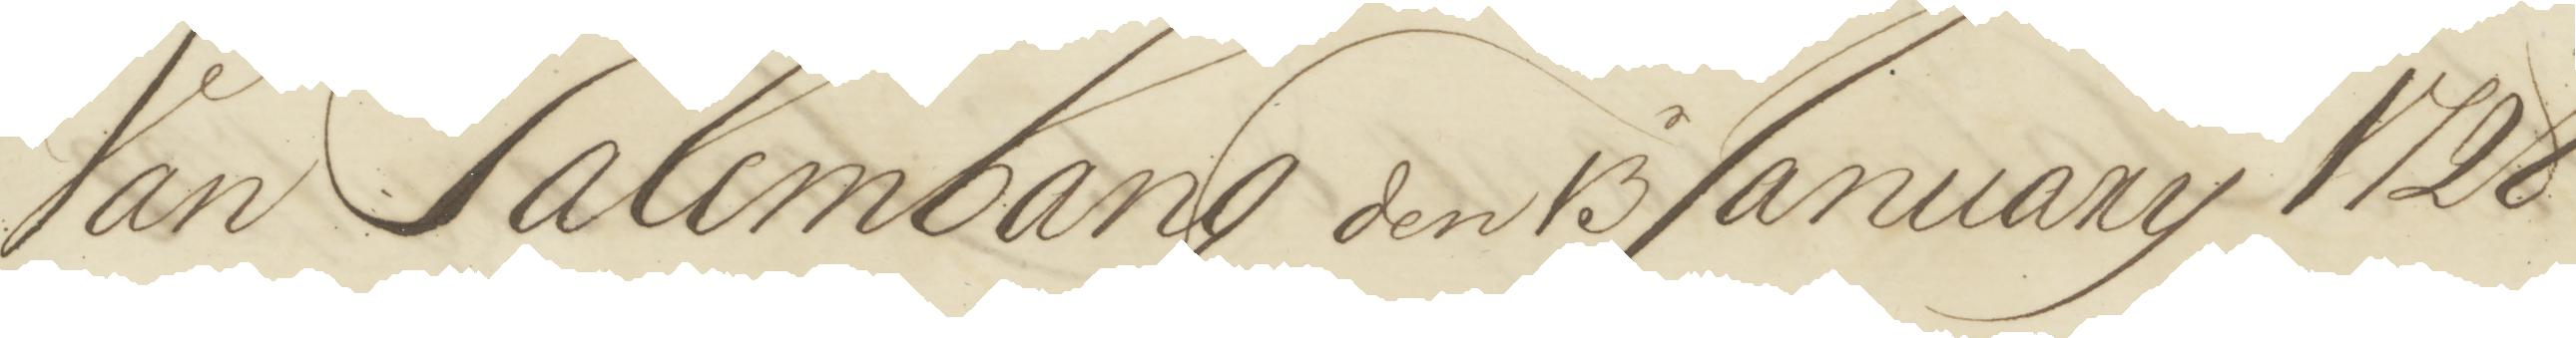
Van Palembang den 13e Januarij 1728
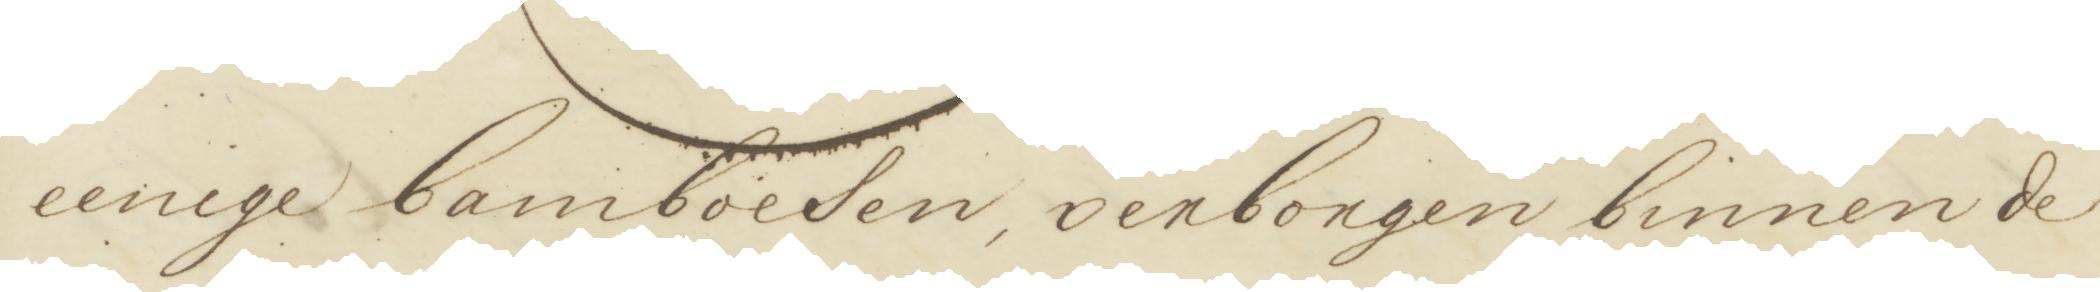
eenige bamboesen, verborgen binnen de
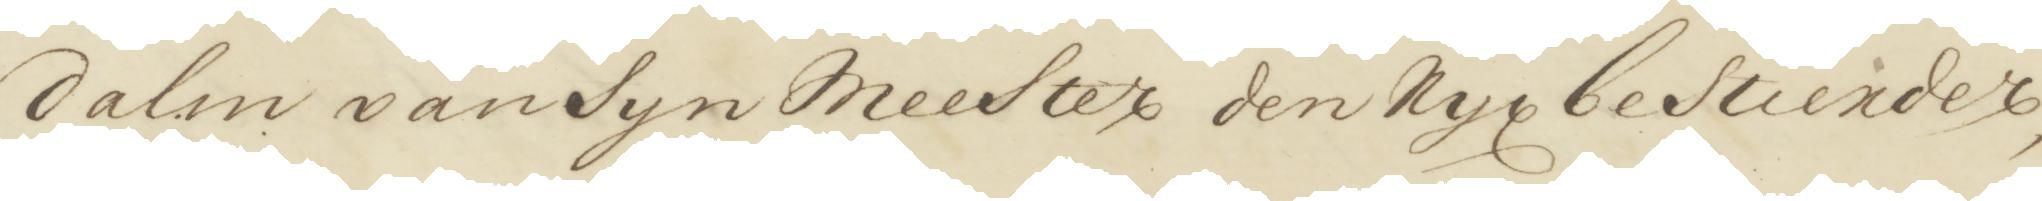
dalm van syn Meester den Ryx bestierder,
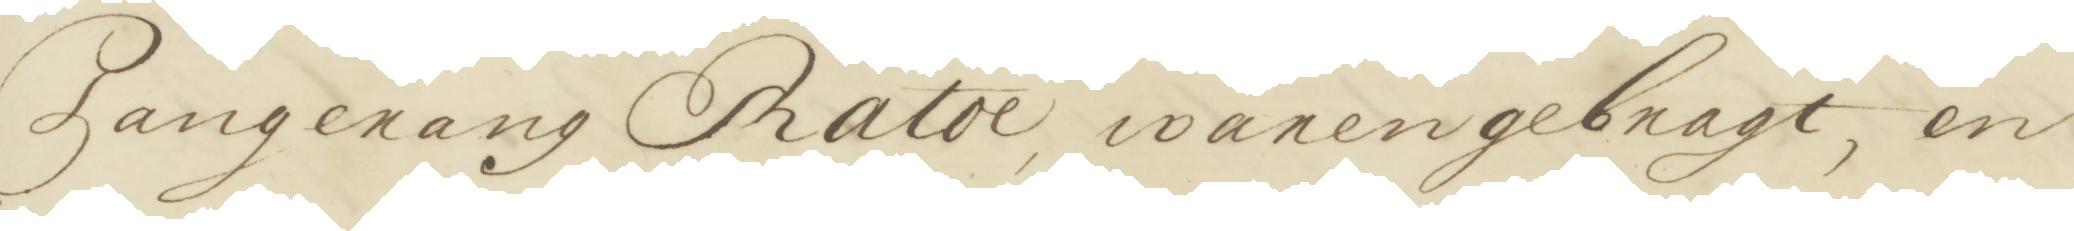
Pangerang Ratoe, waren gebragt, en
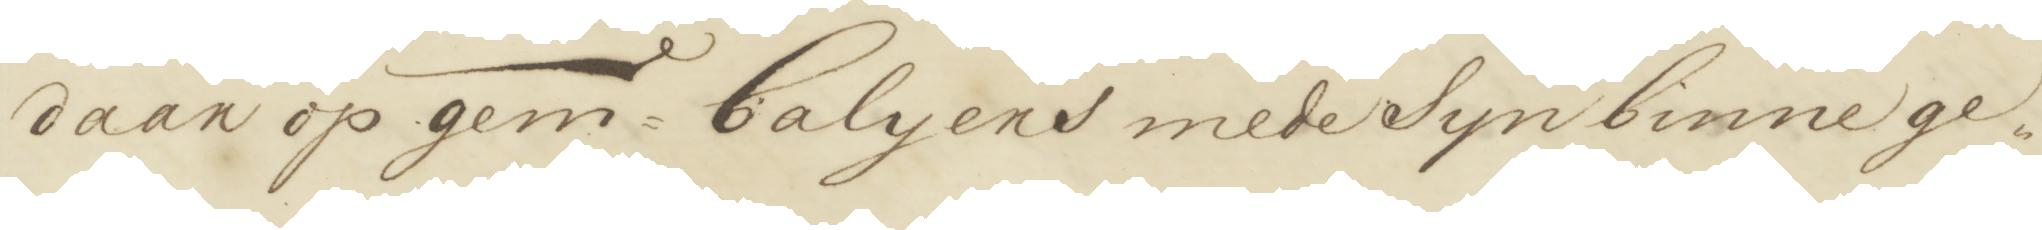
daar op gem:e balyers mede syn binne ge„
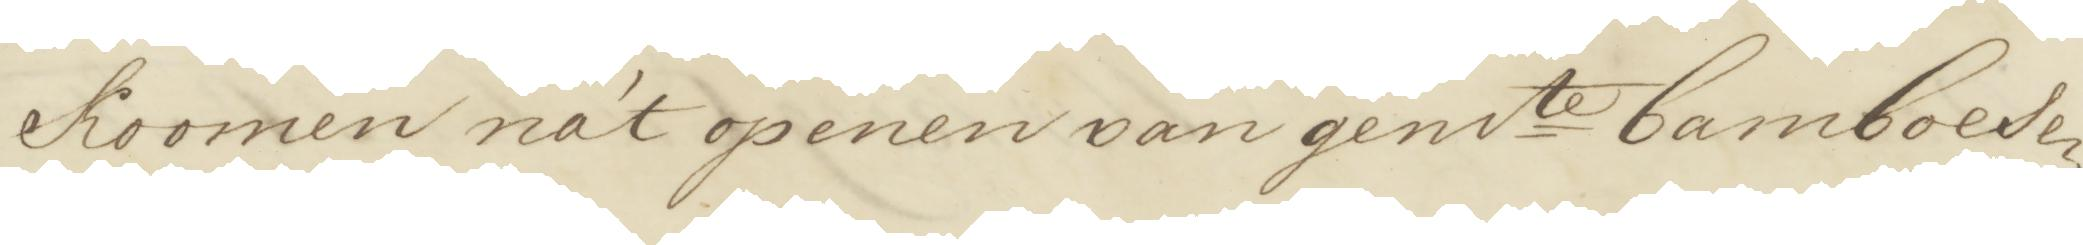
koomen na't openen van gem=te bamboese,
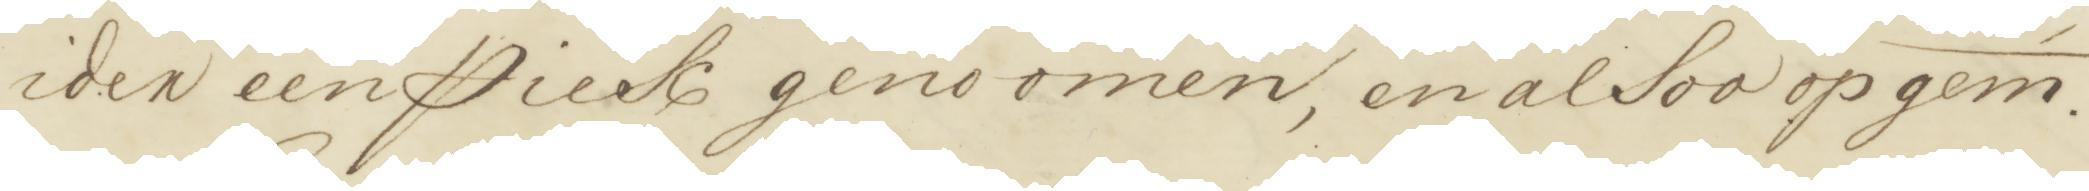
ider een Piek genoomen, en alsoo op gem.
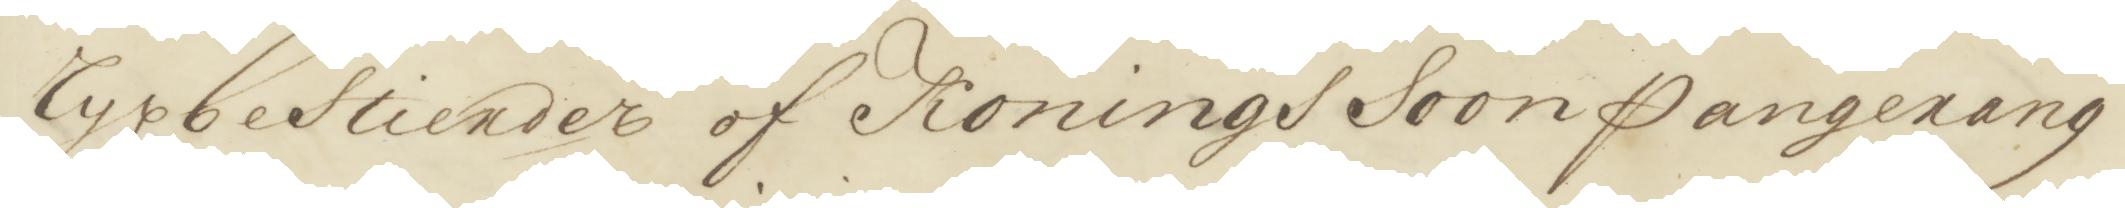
Ryxbestierder of Konings soon Pangerang
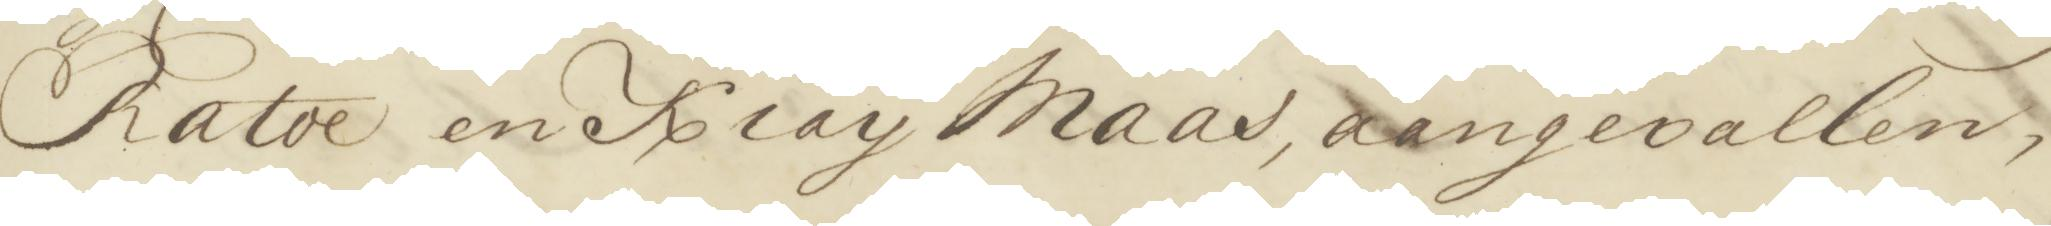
Ratoe en Kiay Maas, aangevallen,
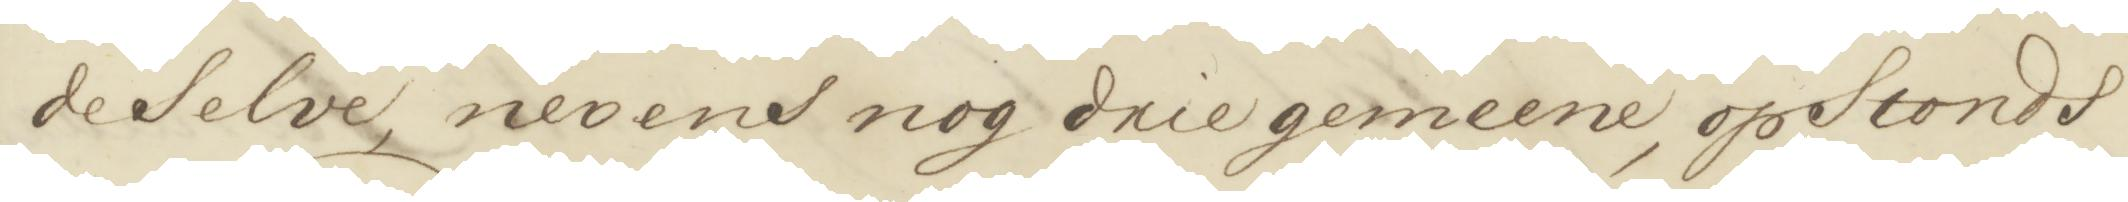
deselve, nevens nog drie gemeene, op stonds
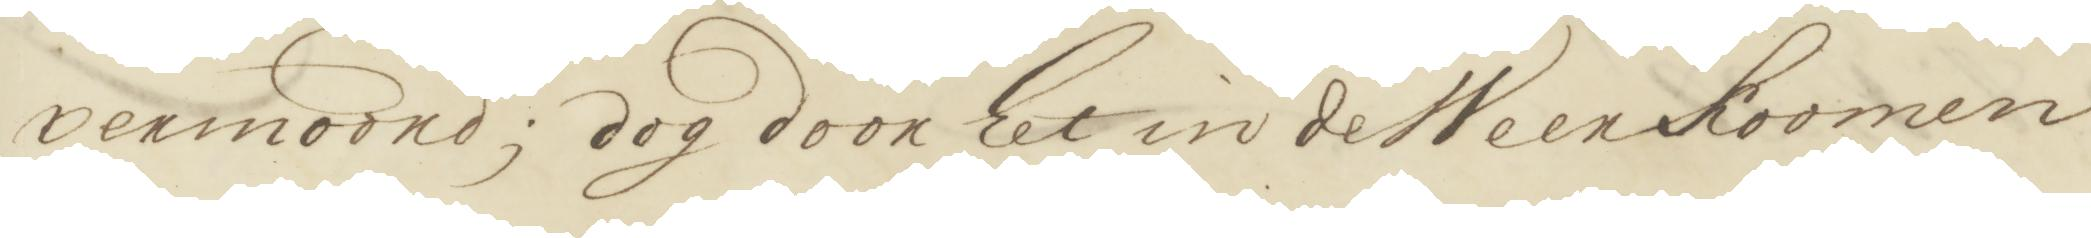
vermoord; dog door het in de Weerkoomen
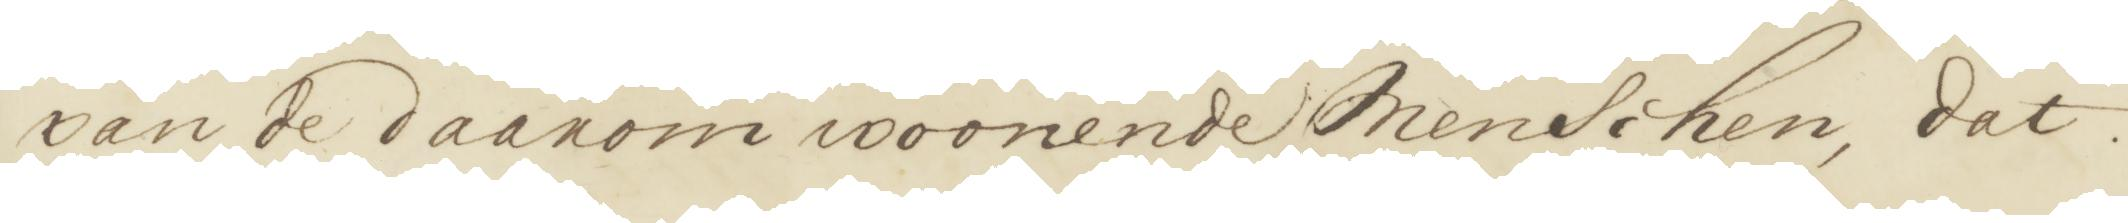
van de daarom woonende Menschen, dat
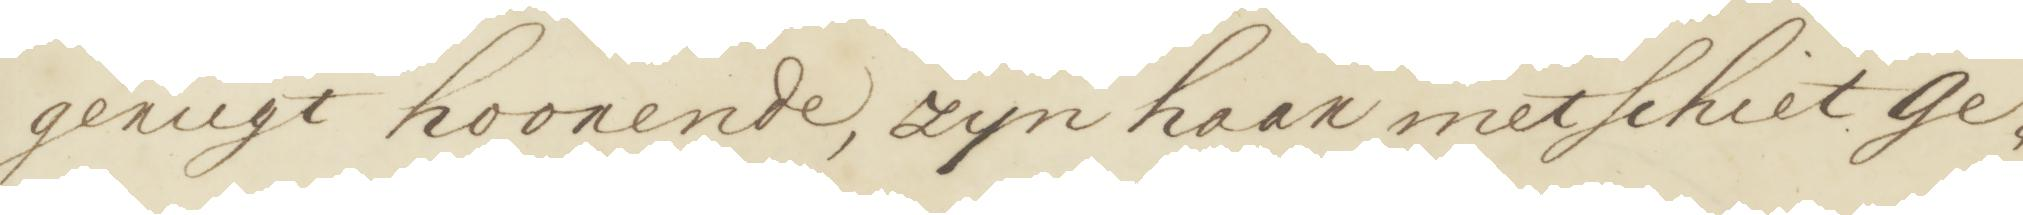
gerugt hoorende, zyn haar met schiet ge„
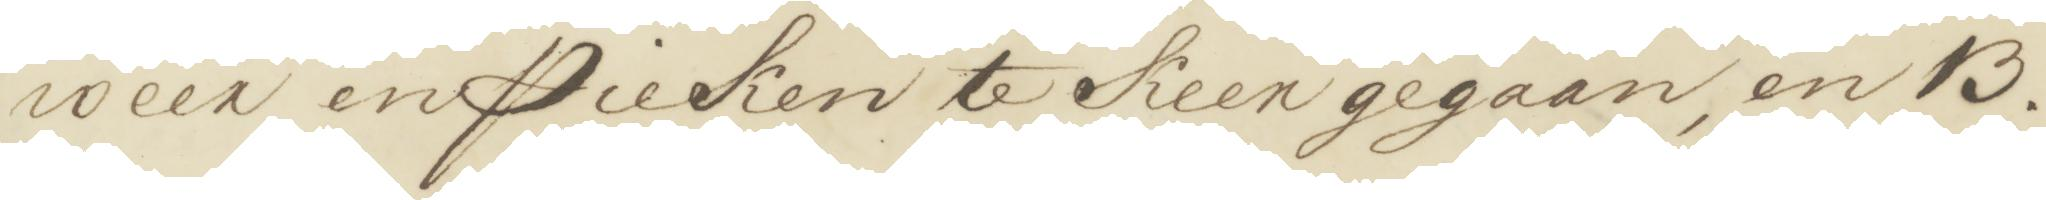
weer en Pieken te keer gegaan, en 13.
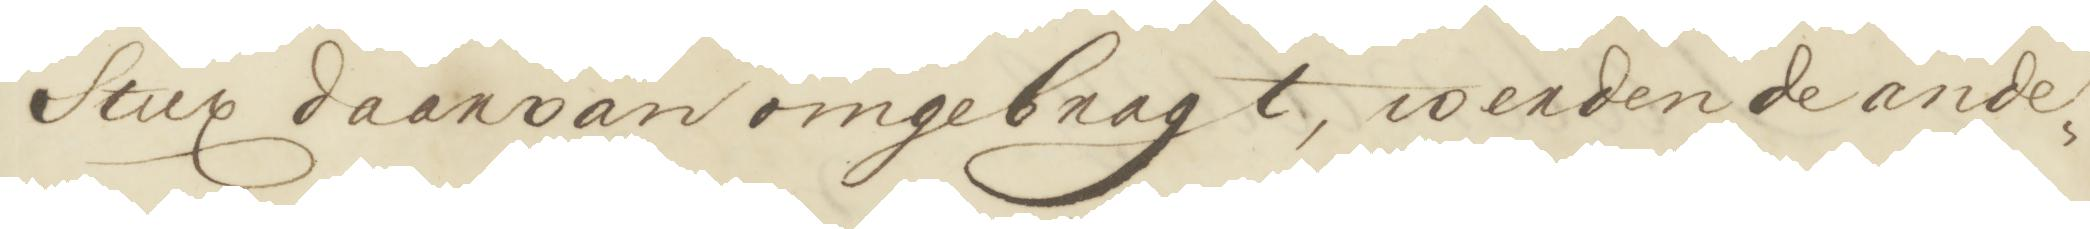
stux daarvan omgebragt, werden de ande„
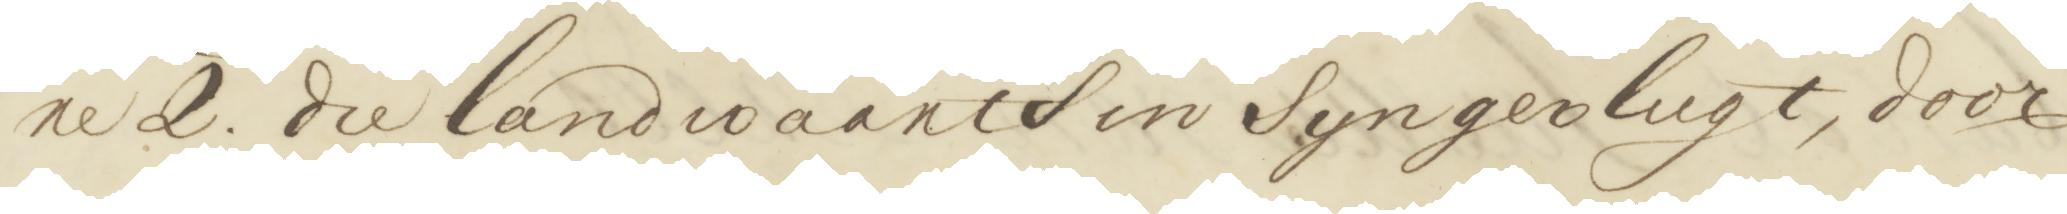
re 2. die landwaarts in syn gevlugt, door
